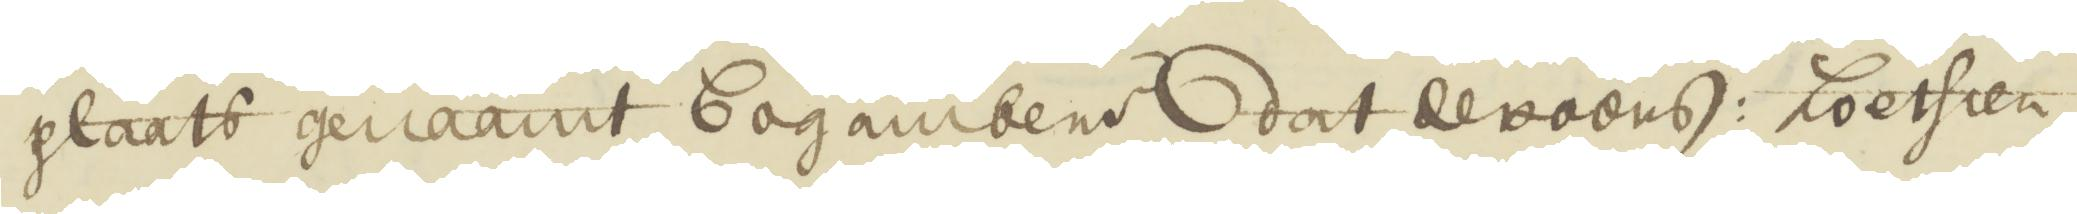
plaats genaamt bogambere dat de voors: koetsier
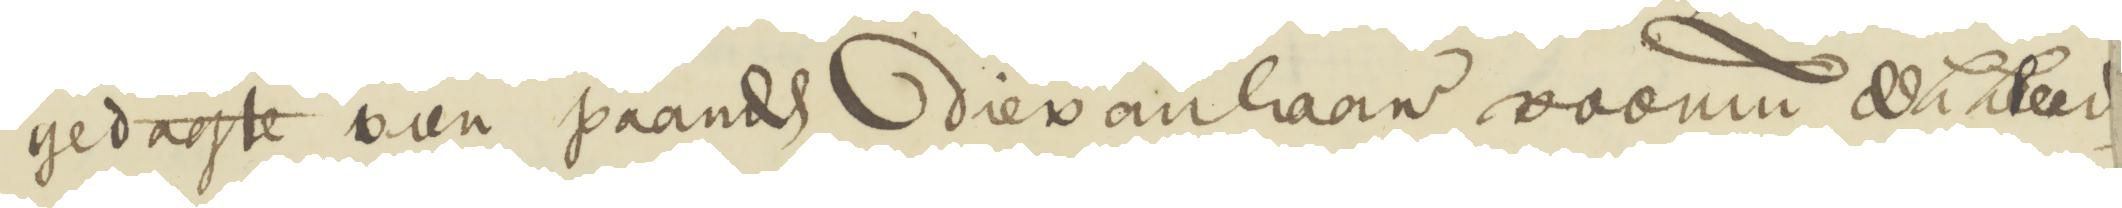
gedagte vier paarden die van haar voorm dekkleed
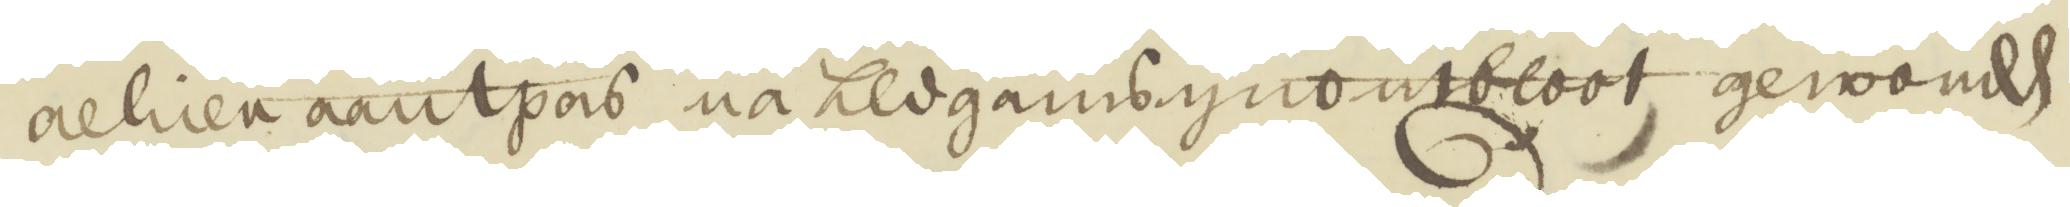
alhier aan't pas na klegam syn ontbloot geworden
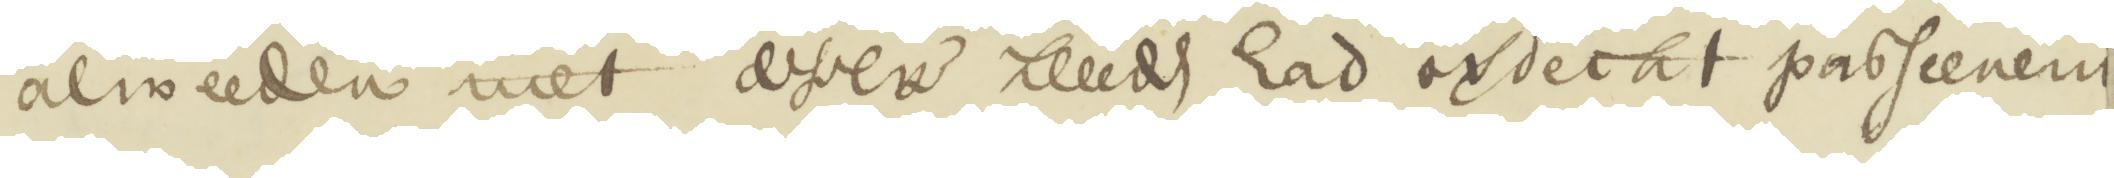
alweeder met deselve kleeden had overdeckt passeeren
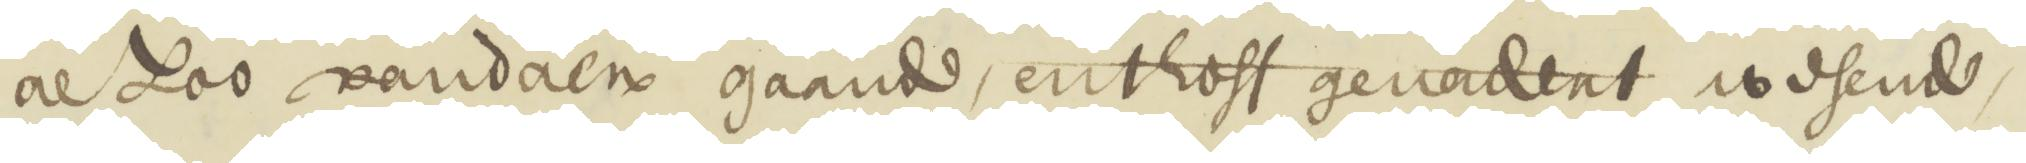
al Zoo vandaer gaande, en 't hoff genadert wesende,
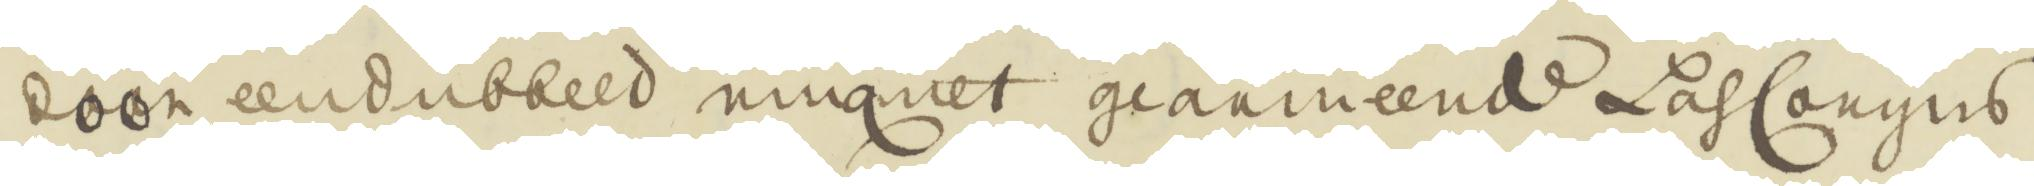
door een dubbeld rinquet gearmeerde Lascoryns
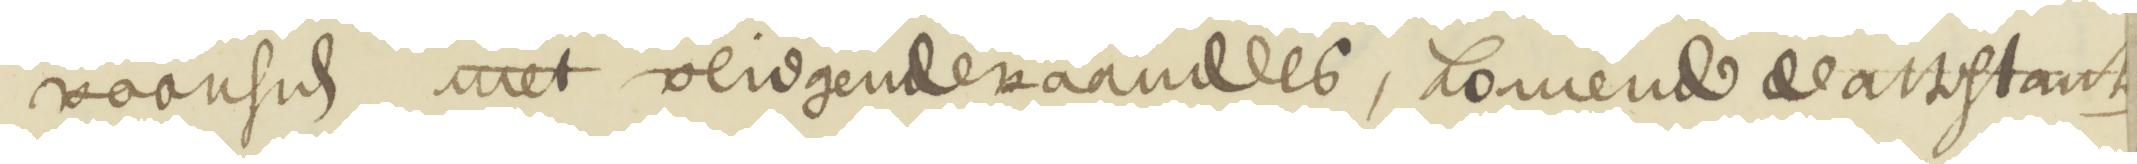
voorsien met vliegende vaandels, komende de attestant
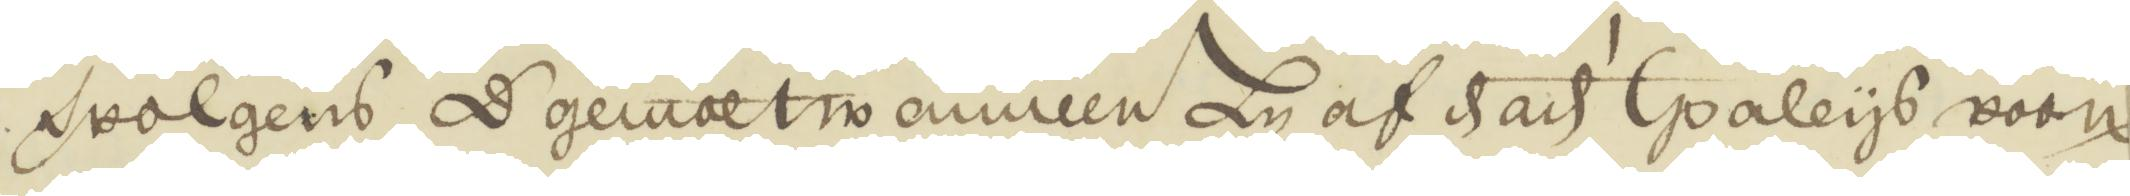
vervolgens te gemoet wanneer Zy af en aen 't paleijs voor
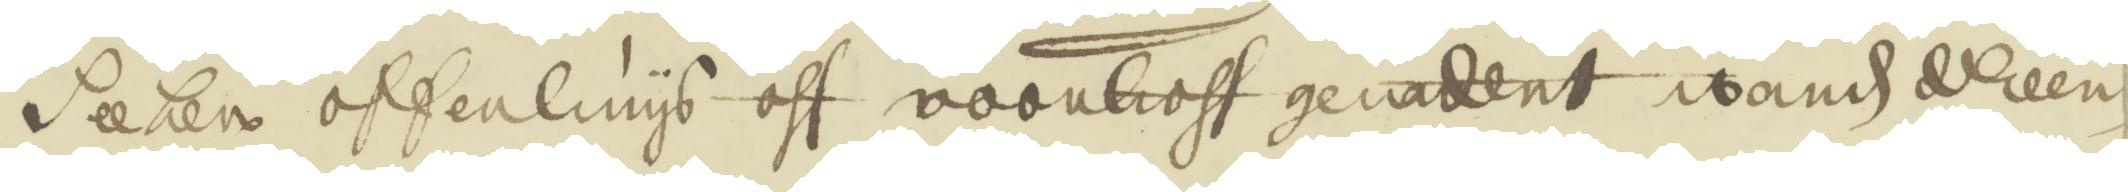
Seeker offerhuijs off voorhoff genadert waren de heer
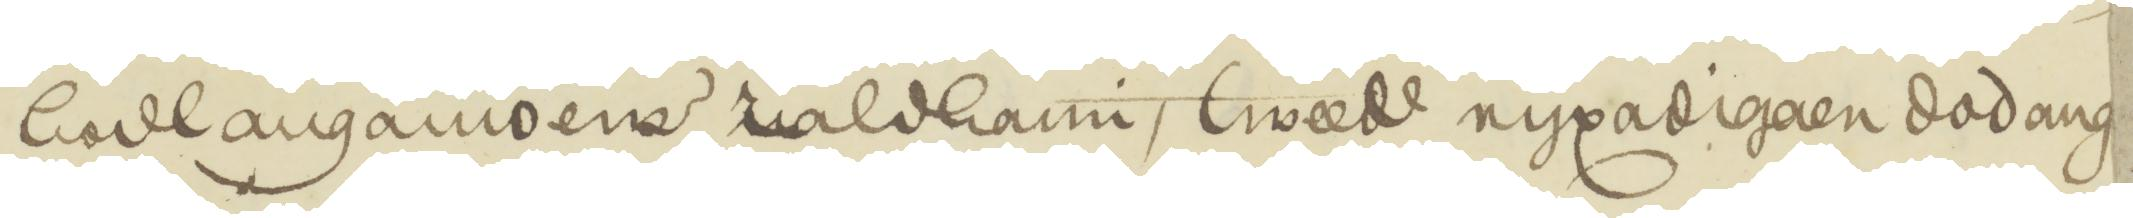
hoel angamoewe ralehami, tweede rijxadigaer dodang
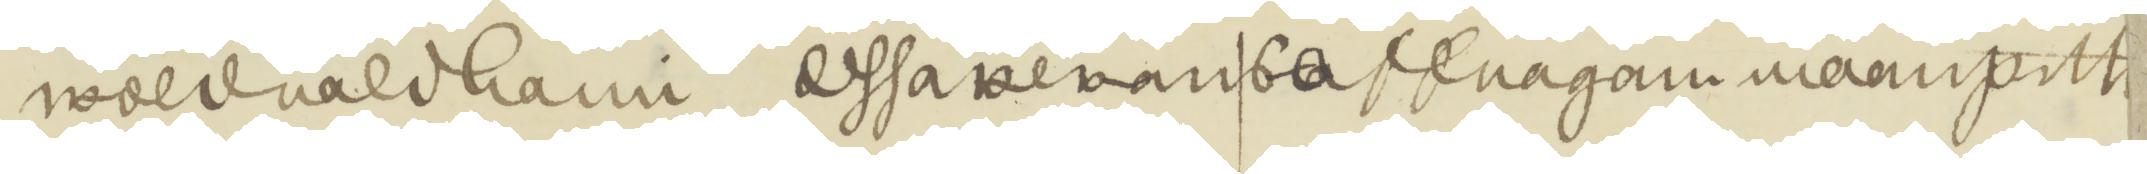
weleralehami dessave van saffragam maanpitt
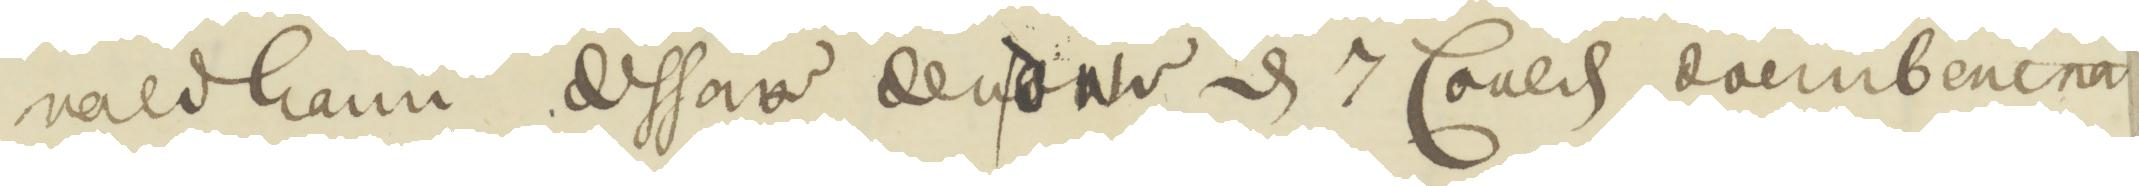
ralehami dessave dendrie en 7 Corlen doembercra
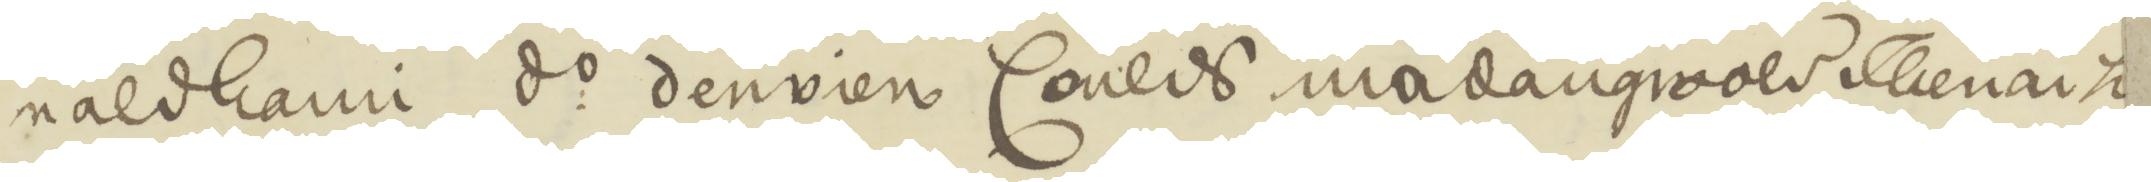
ralehami d:o dervier Corles madangwole Ehenai k
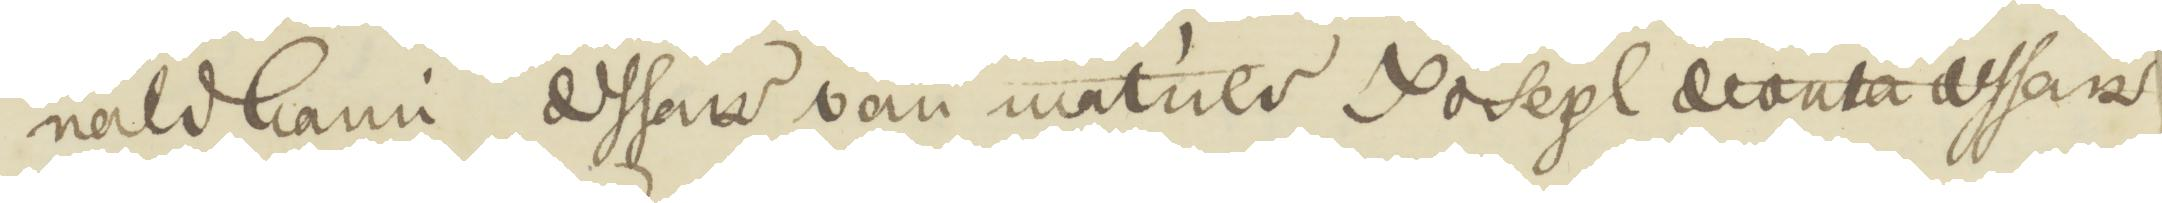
ralehami dessave van matule Ioseph deorta dessave
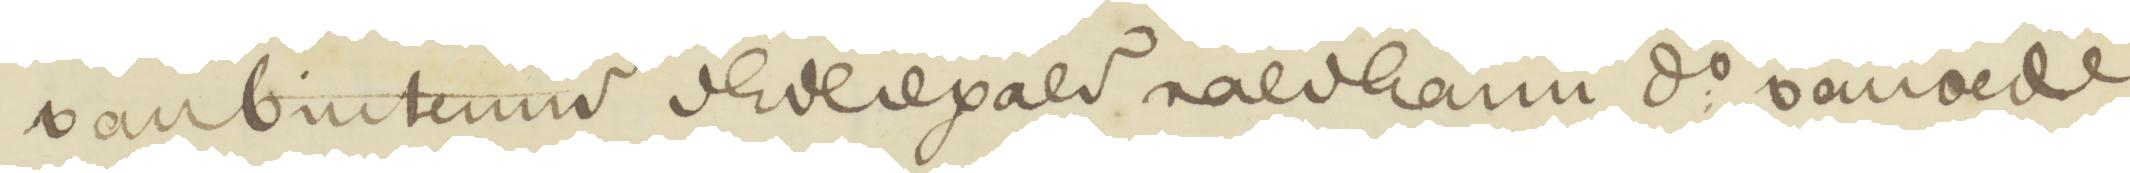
van bintemie ehelepale ralehami d:o van oede
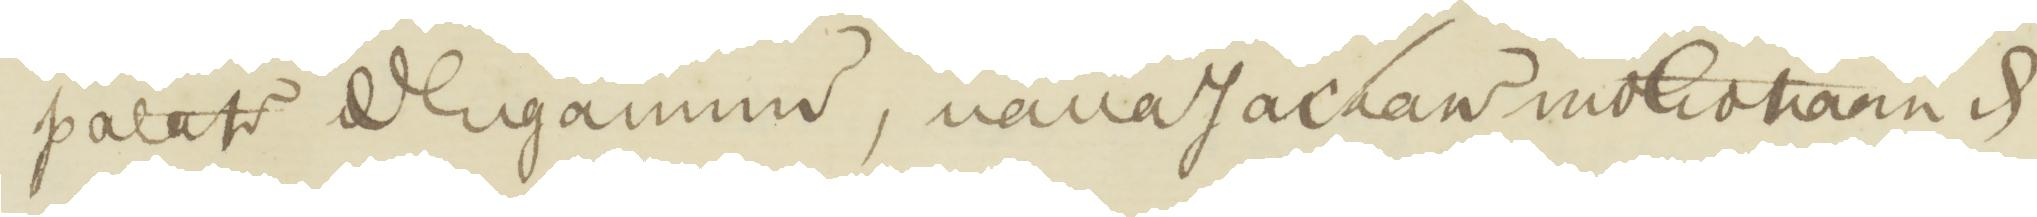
palate de higamme, nana Jackane mohotiaan en
